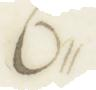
6„
